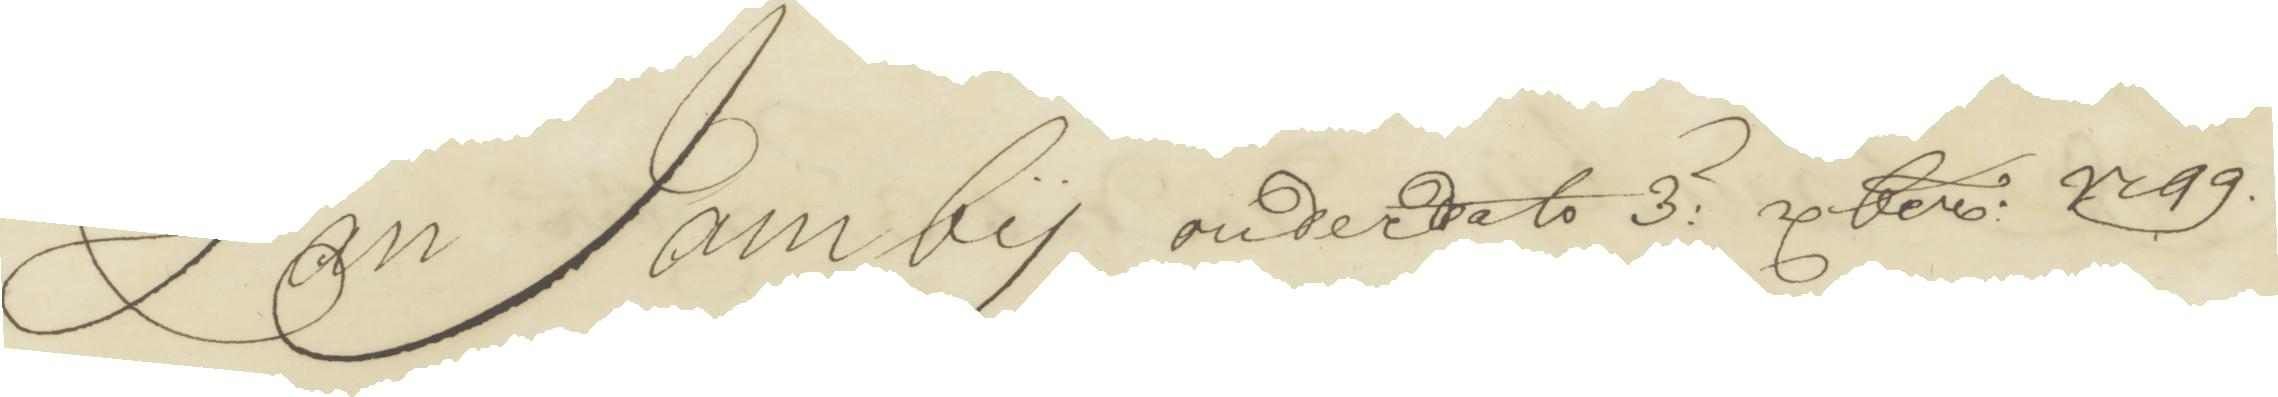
Van Jambij onder dato 3:' xber: 1749.
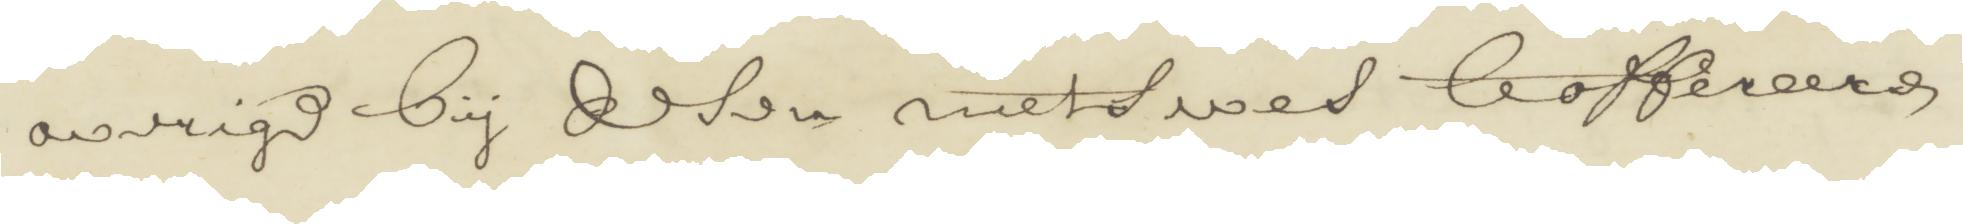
overige bij desen niets wes te offereeren
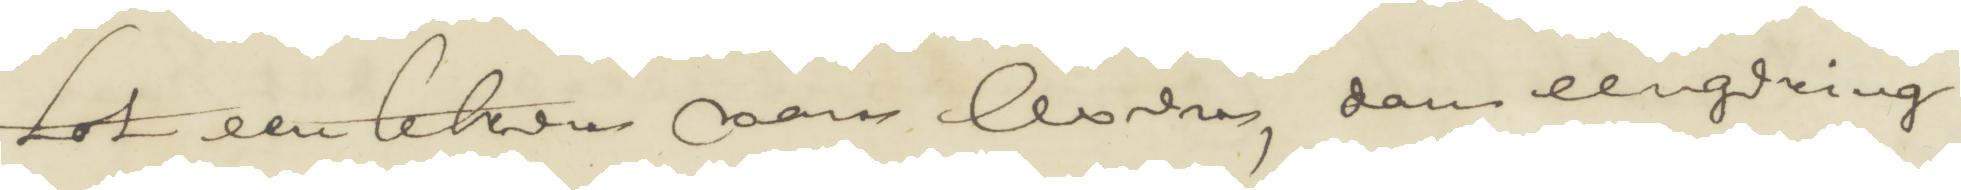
tot een teken van leven, den een gering
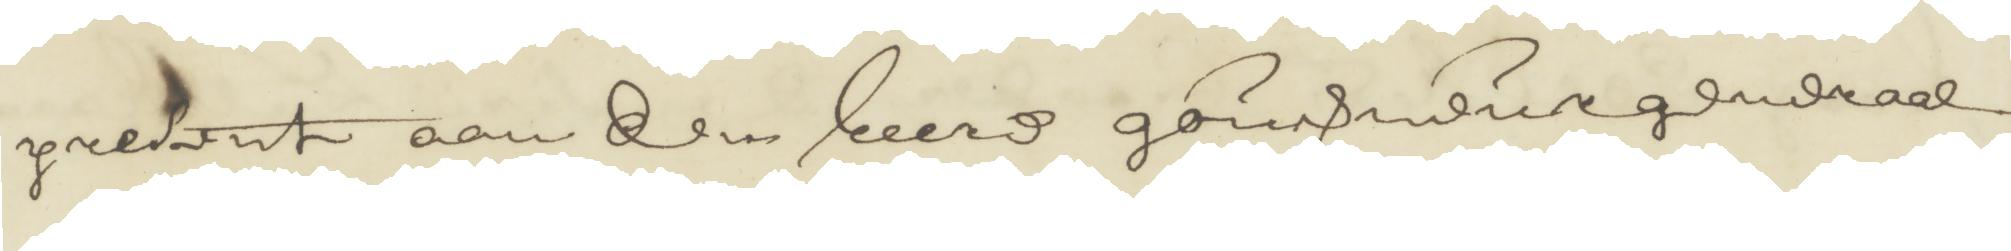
present aan den heere gouveneur generaal,
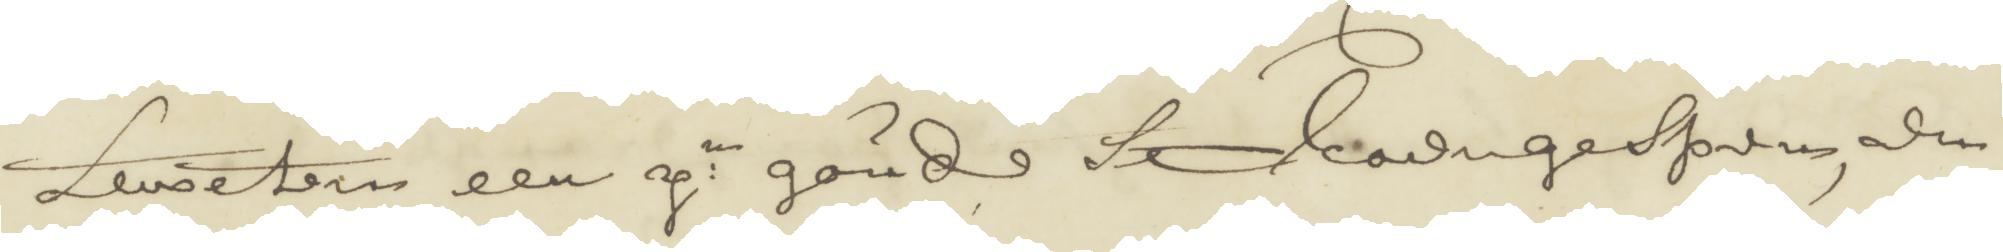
teweeten een p:r goude schoengespen, en
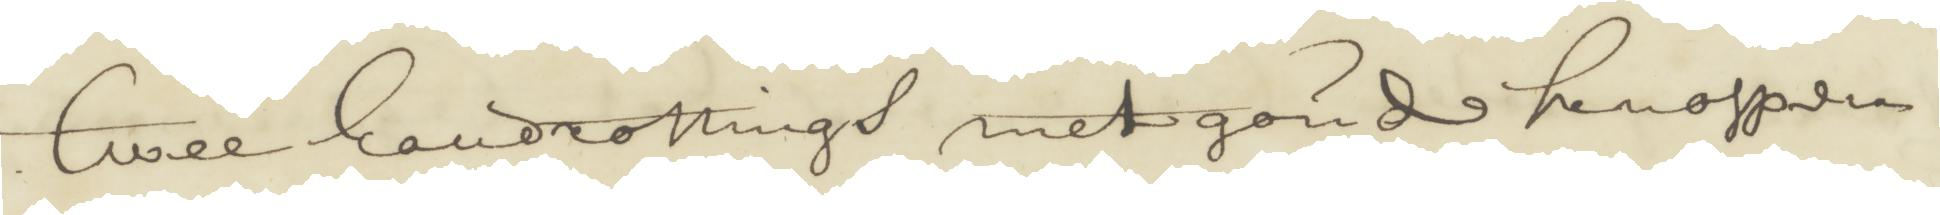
twee handrottings met goude knoppen
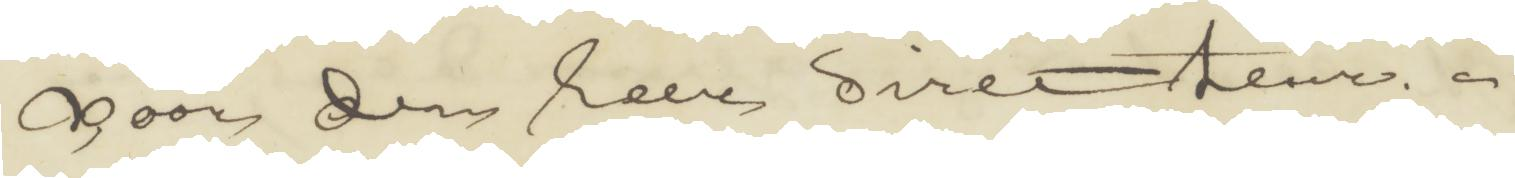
voor den heer directeur.
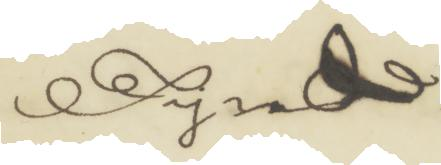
Sijnde
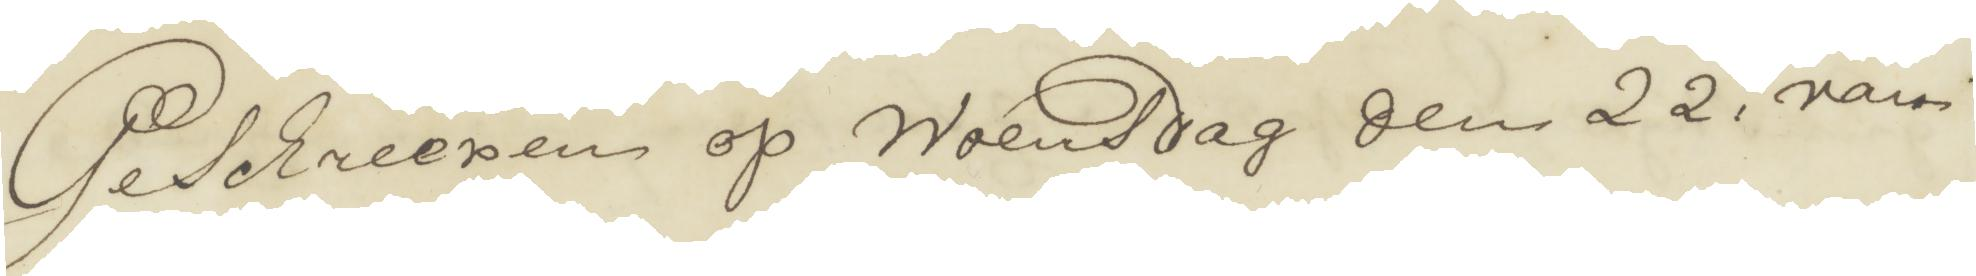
Geschreeven op Woensdag den 22:' van
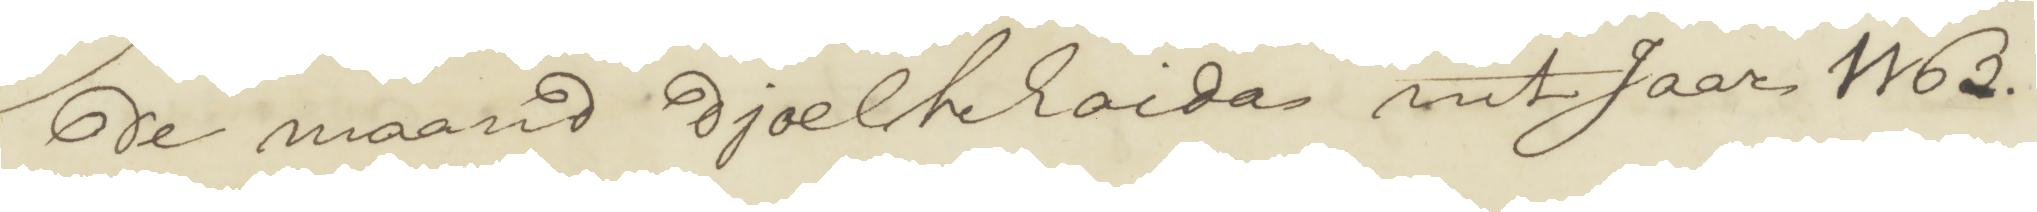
de maand djoelkhaidas in’t jaar 1762.
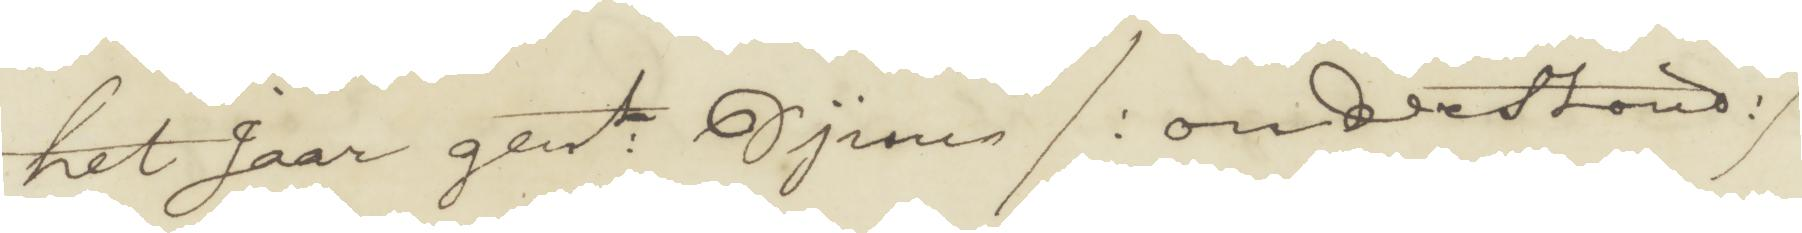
het jaar gen:t Djims /:onderstond:/
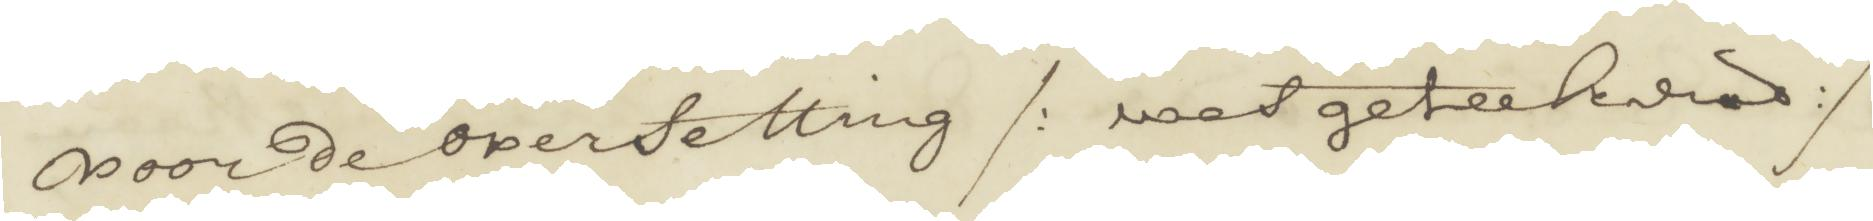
voor de oversetting /:was geteekend:/
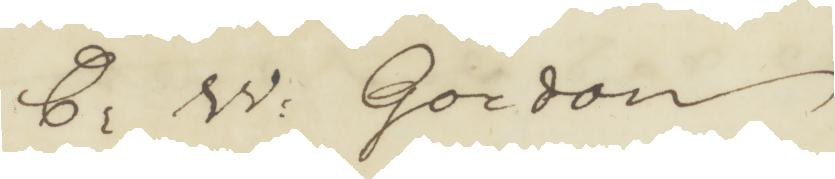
B: W: Gordon
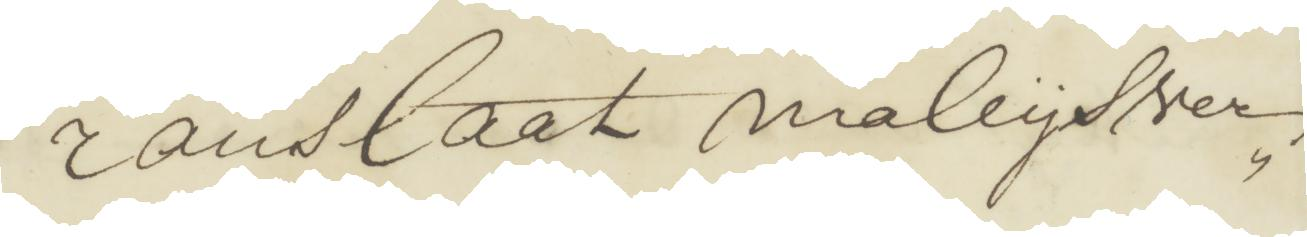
ranslaat maleijs ver„
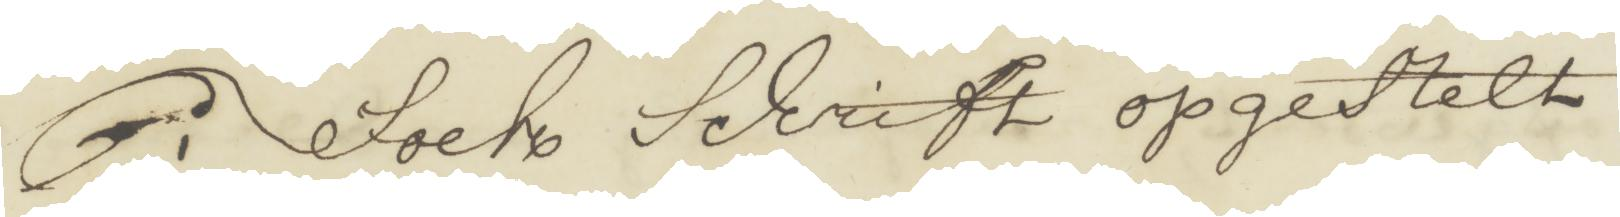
soek schrift opgestelt
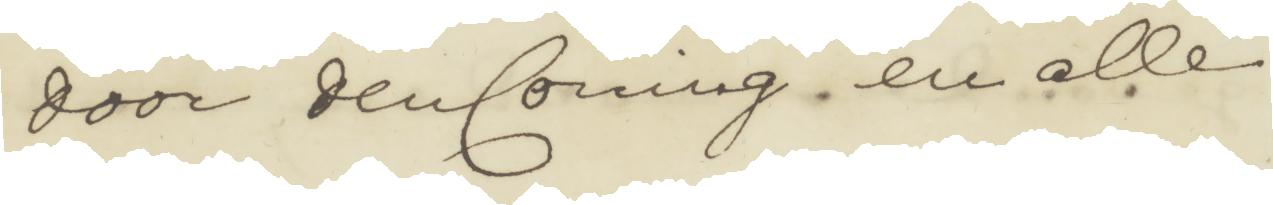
door den Coning en alle
